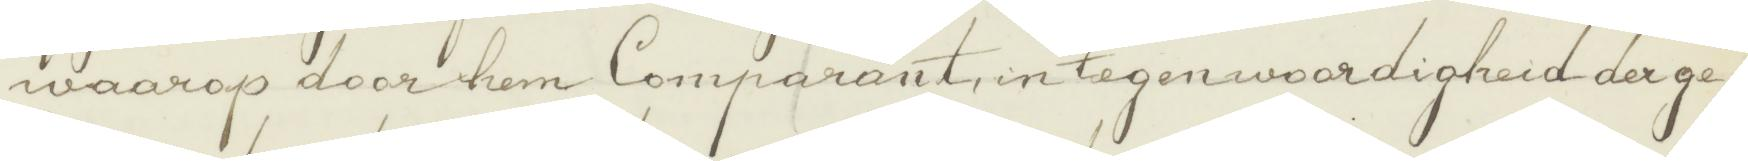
waarop door hem Comparant, in tegenwoordigheid der ge
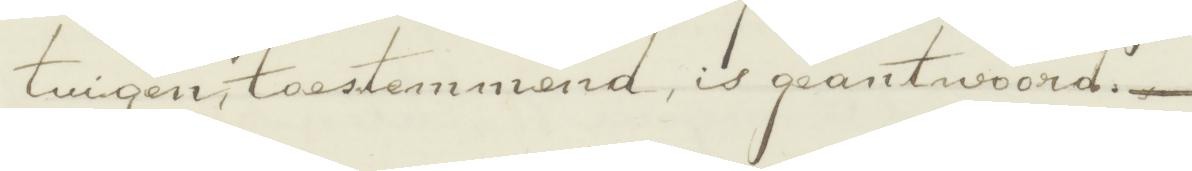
tuigen, toestemmend, is geantwoord._
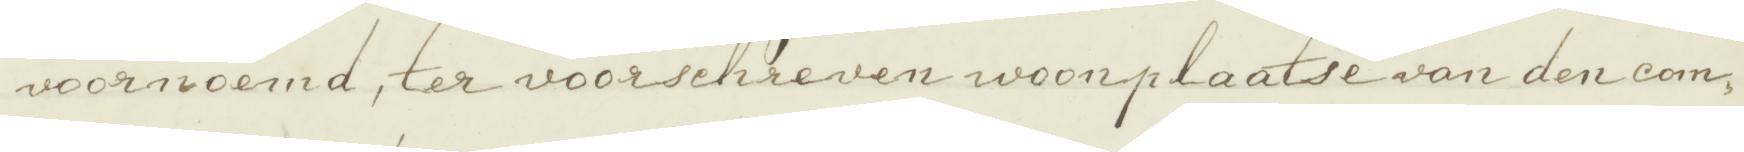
voornoemd, ter voorschreven woonplaatse van den com„
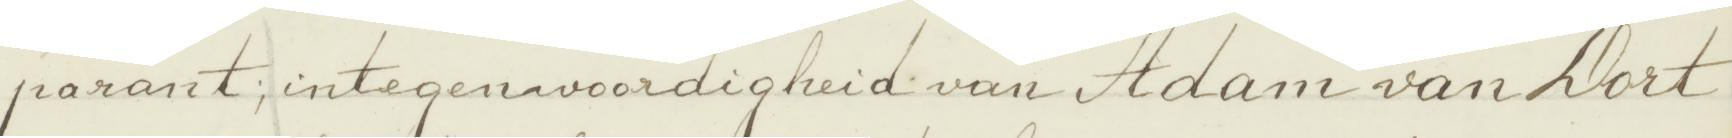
parant; integenwoordigheid van Adam van Dort
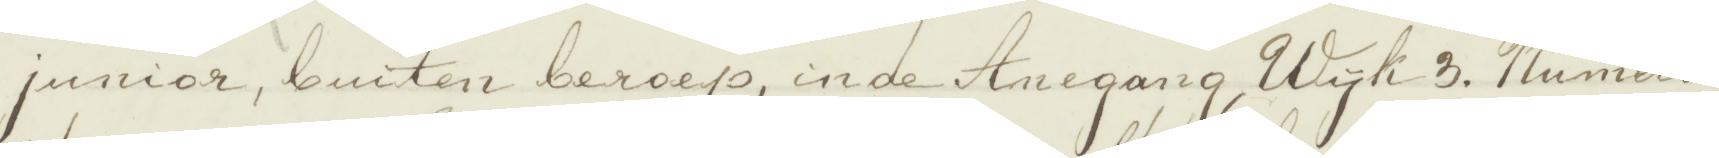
junior, buiten beroep; in de Anegang, Wijk 3. Numero
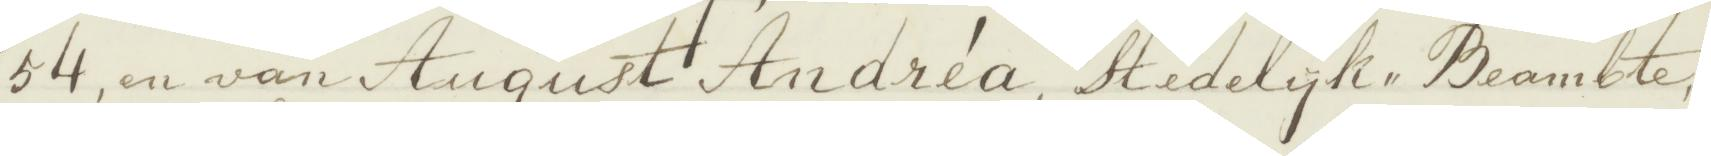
54, en van August Andréa, Stedelijk„ Beambte,
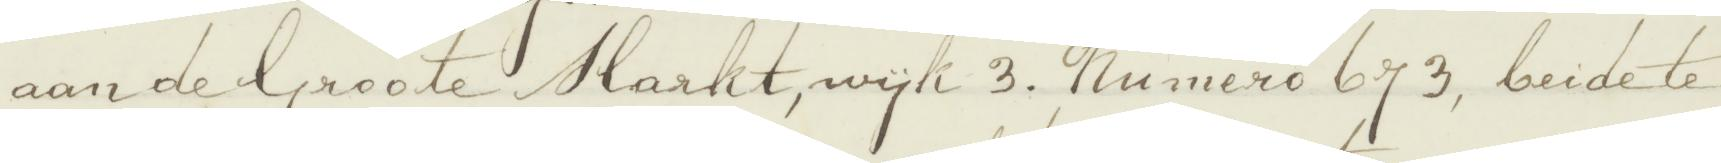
aan de Groote Markt, wijk 3. Numero 673, beide te
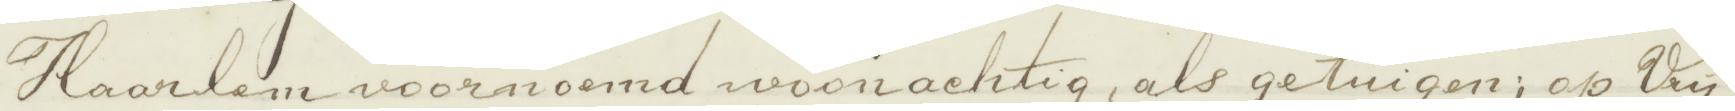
Haarlem voornoemd woonachtig, als getuigen; op Vrij
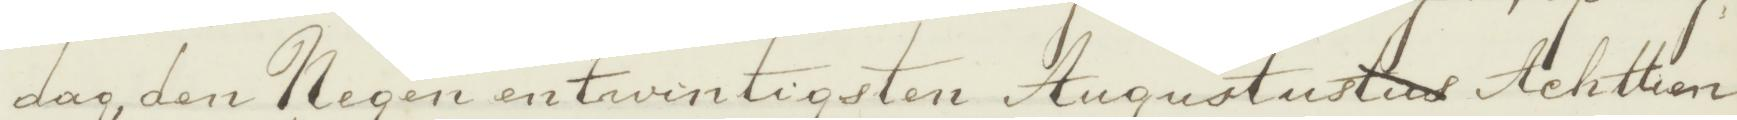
dag den Negen en twintigsten Augustus Achttien
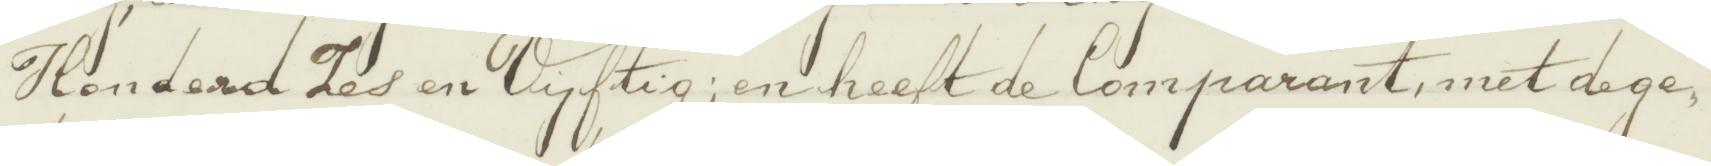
Honderd Zes en Vijftig; en heeft de Comparant, met de ge„
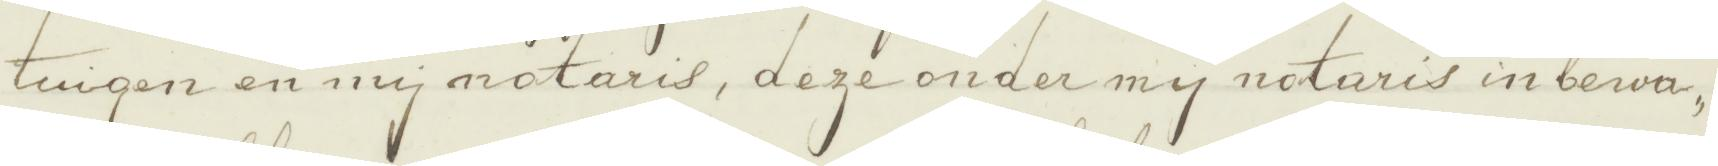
tuigen en mij notaris, deze onder mij notaris in bewa„
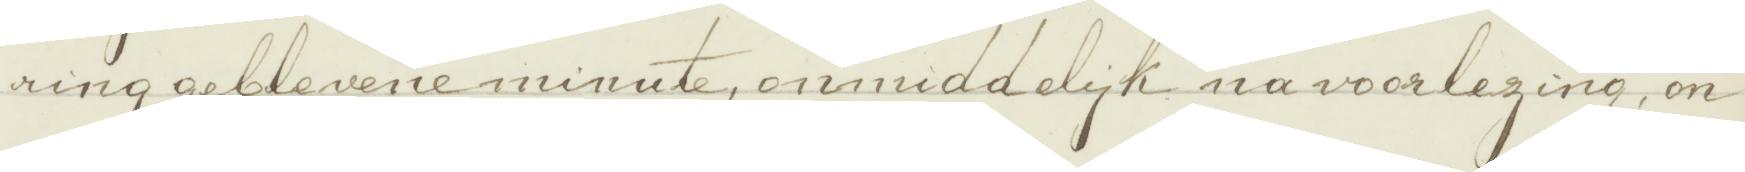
ring geblevene minute, onmiddelijk na voorlezing, on
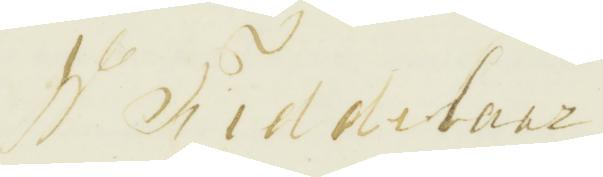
W Fiddelaar
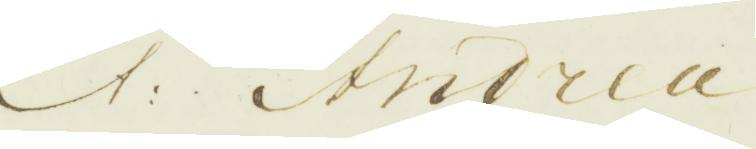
A: Andrea
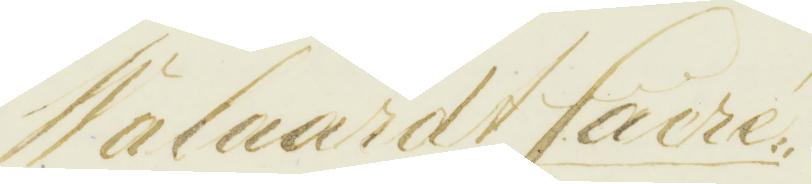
Walaardt Sacré„
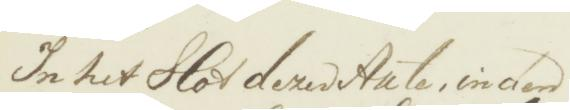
In het Slot dezer Akte, in den
